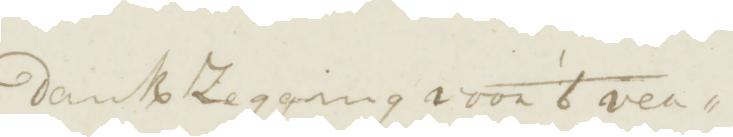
dank zegging voor ’t ver„
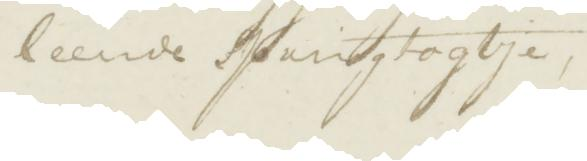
leende springtogtje,
